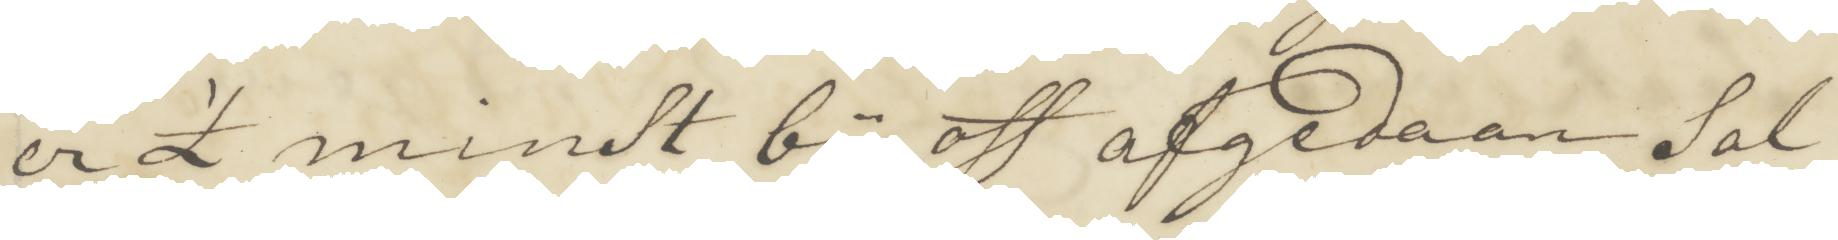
er ’t minst bij off afgedaan Sal
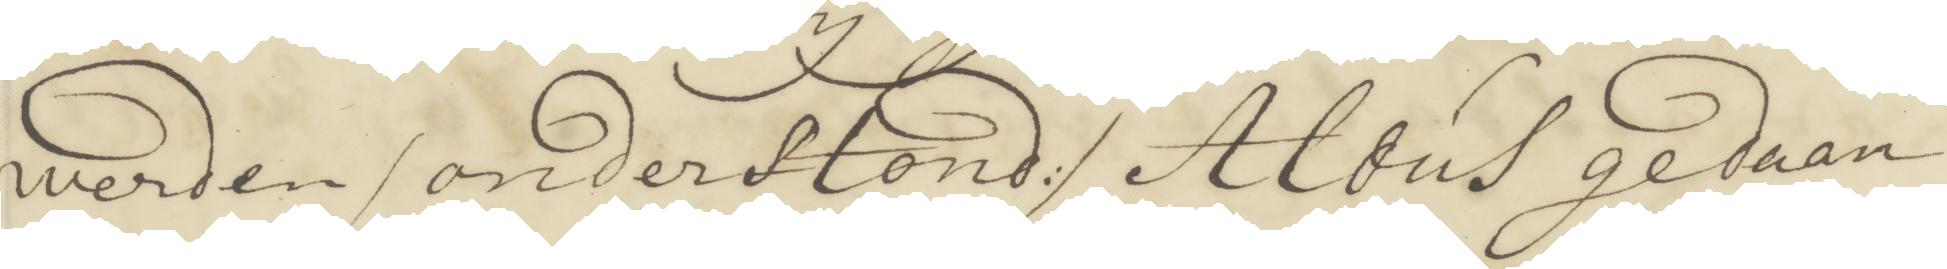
werden /onderstond:/ Aldus gedaan
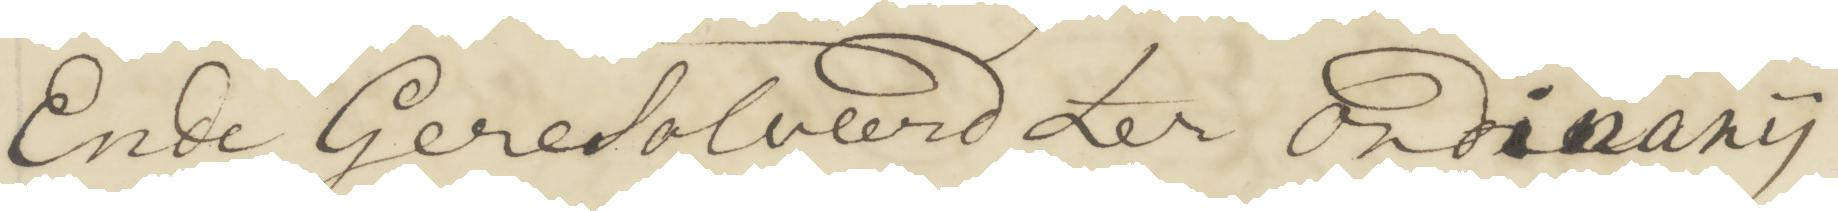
Ende Geresolveerd ter ordinarij
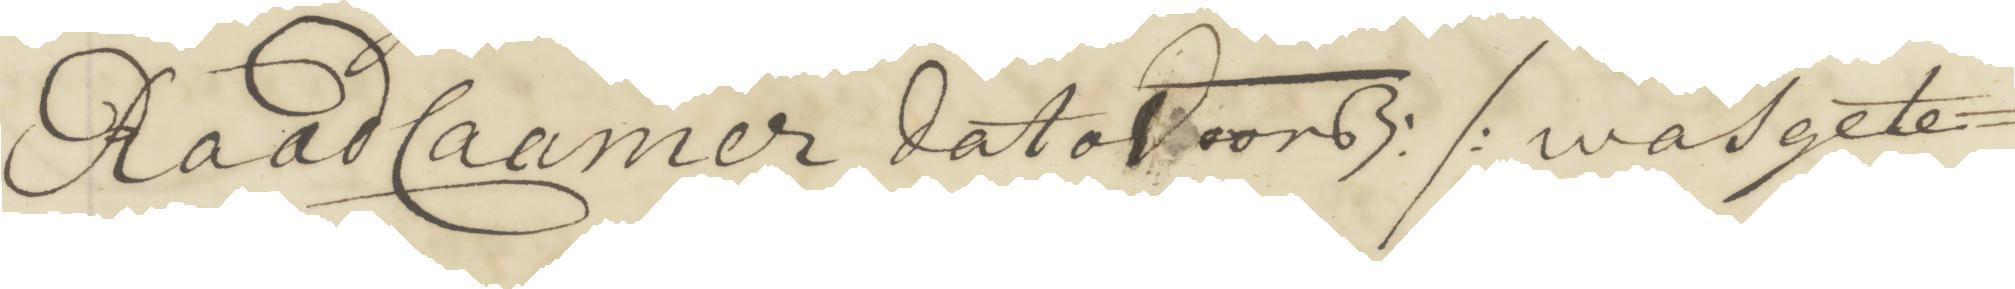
Raad Caamer dato Voorsz: /:was gete=
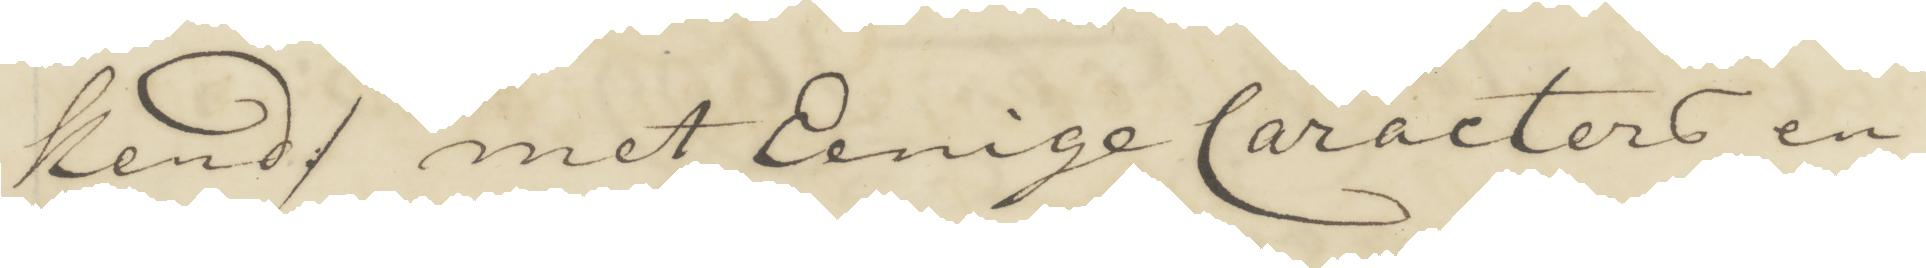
kend:/ met Eenige Caracters en
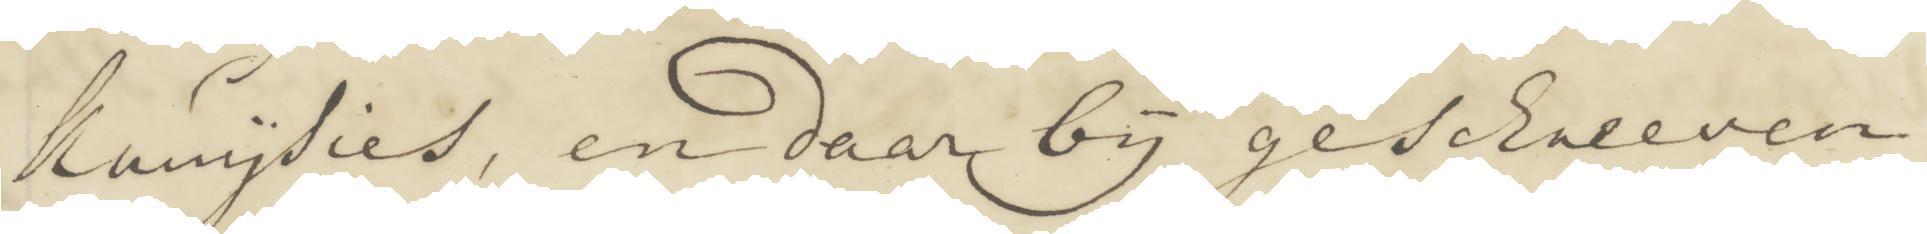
kruijsies, en daar bij geschreeven
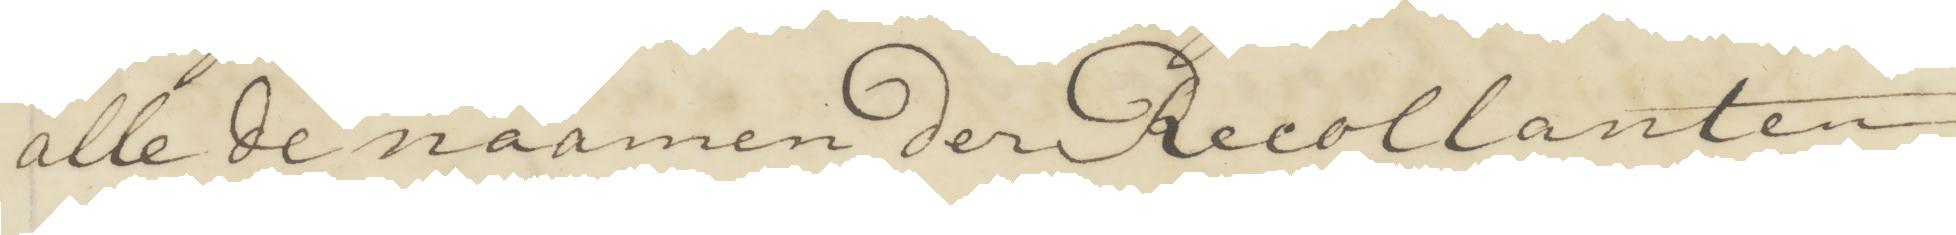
alle de naamen der Recollanten
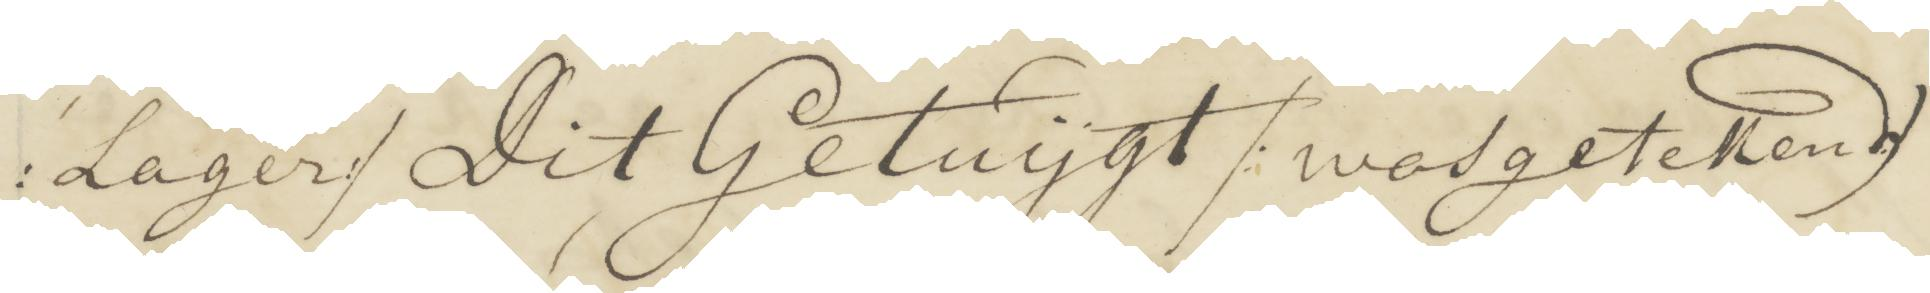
/:Lager:/ Dit Getuijgt /:was getekend:/
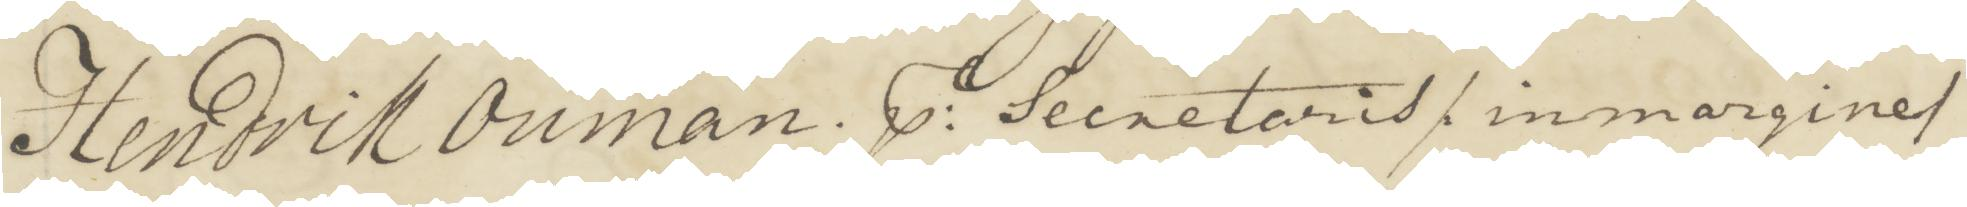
Hendrik Ouman. p:l secretaris /:in margine/
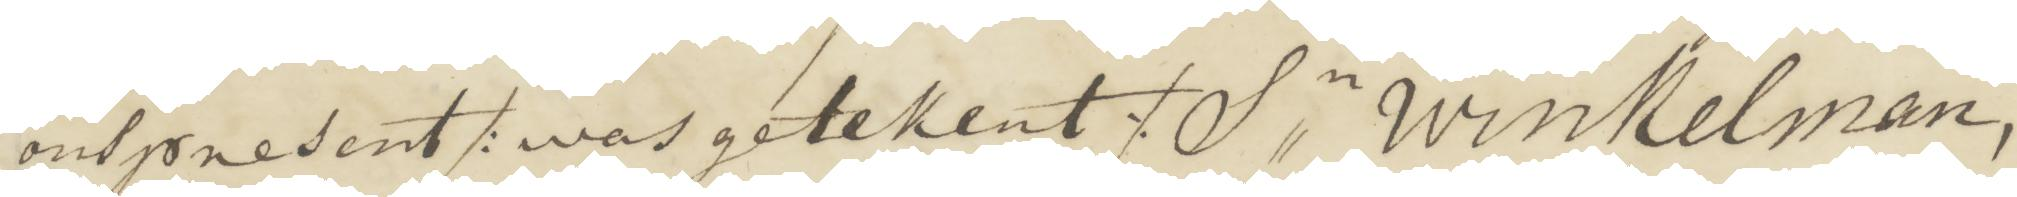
ons present /:was getekent:/ S„n winkelman,
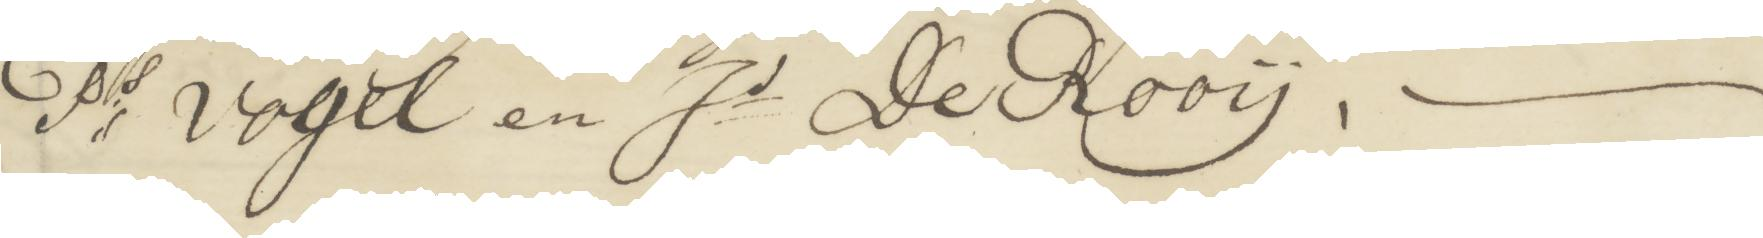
P„s vogel en J=s De Rooij. —
